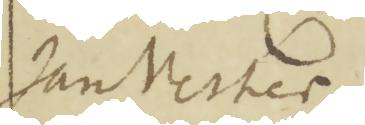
Jan Vester
